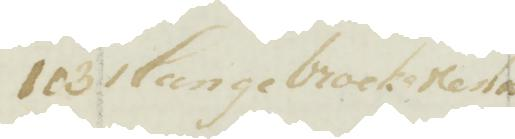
103 1 lange broeksvest
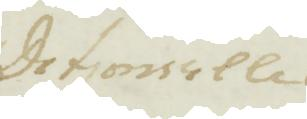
Detjonsville
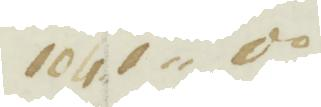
104. 1 „ do
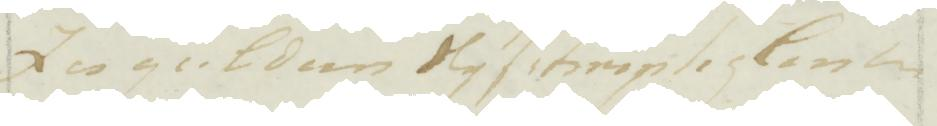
Zes guldens Vyf entwintig Cents
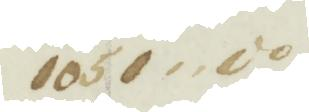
105. 1 „ do
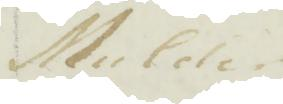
Mulder
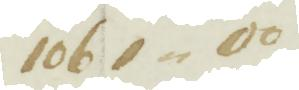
106 1 „ do
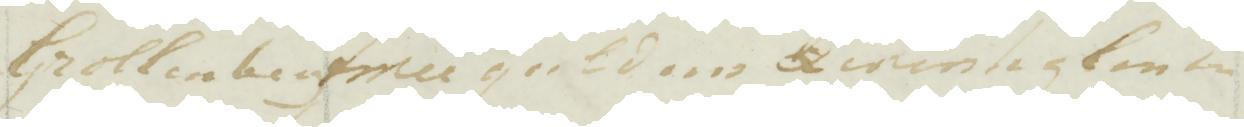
Grollenberg twee guldens zeventig Cents
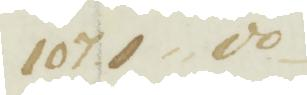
107. 1 „ do
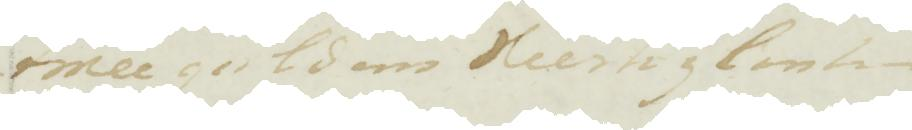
twee guldens Veertig Cents
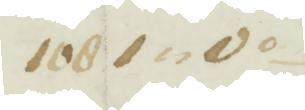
108 1 „ do
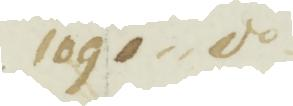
109 1 „ do
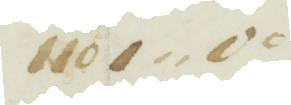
110 1 „ do
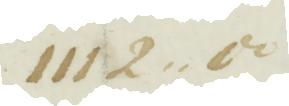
111 2„ d:o
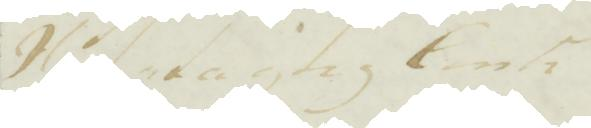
Vijf en tagtig Centen
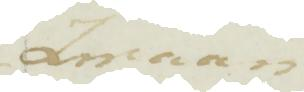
Zwaan
